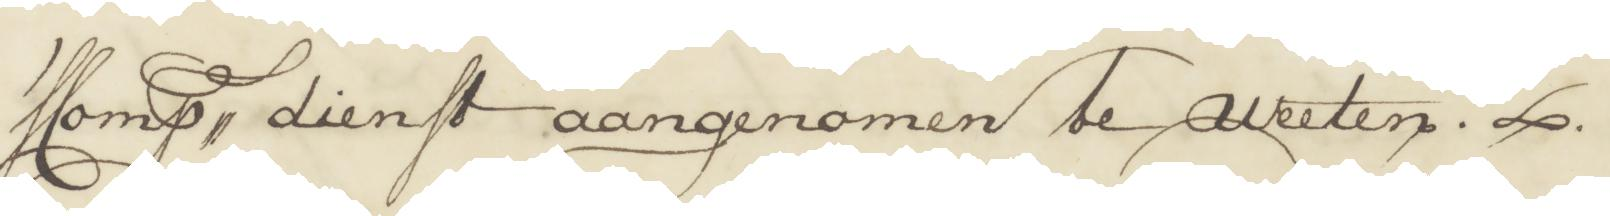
'sComp„s dienst aangenomen te weeten. — .
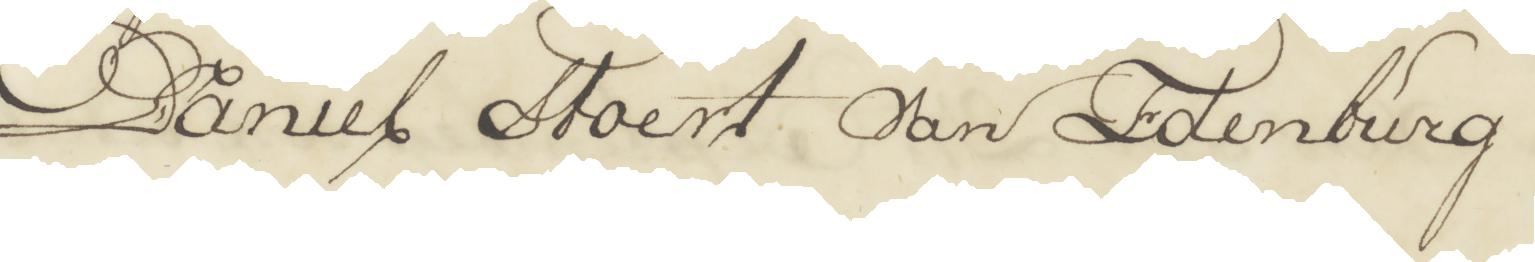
Daniel Stoert van Edenburg
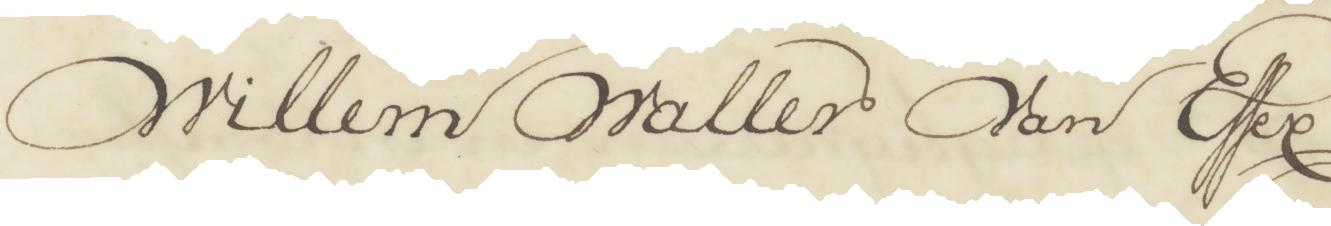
Willem Waller van Essex
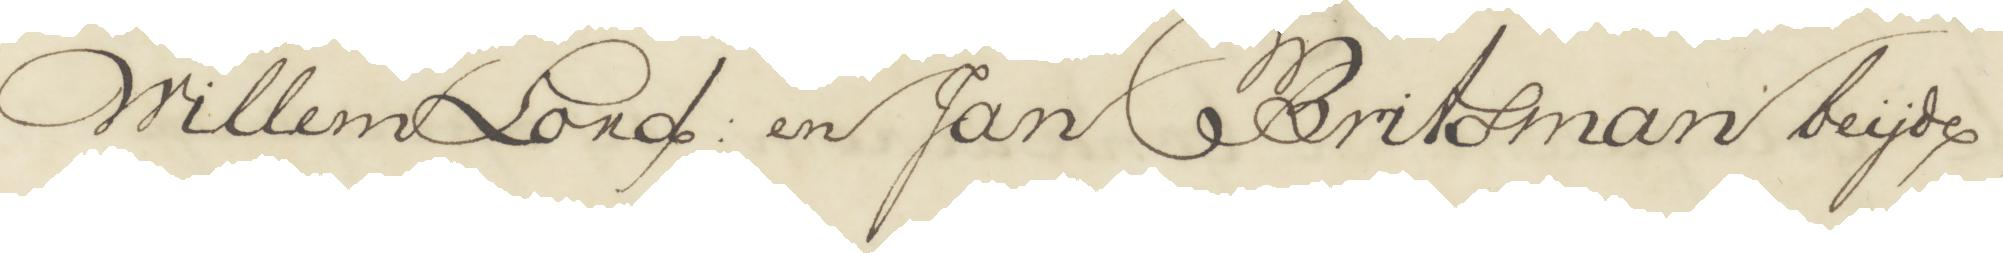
Willem Lord: en Jan Britsman beijde
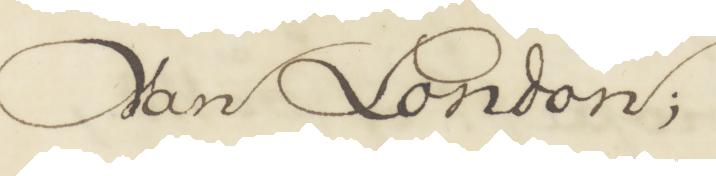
van London;
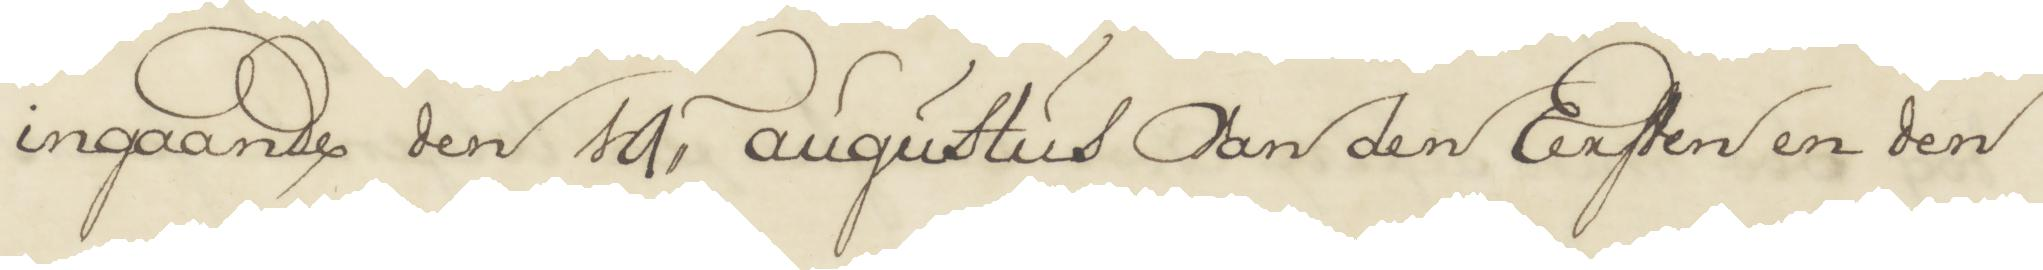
ingaande den 14„' augustus van den Eersten en den
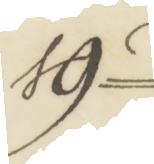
19='
